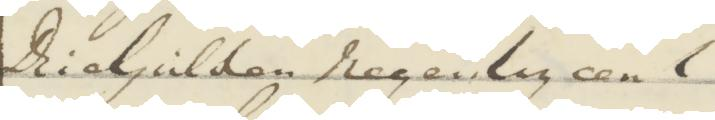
Drie Gulden negentig cent
